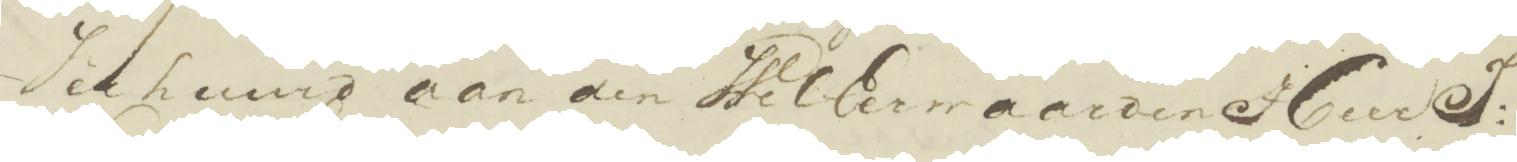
Verhuurd aan den Wel Eerwaarden Heer I:
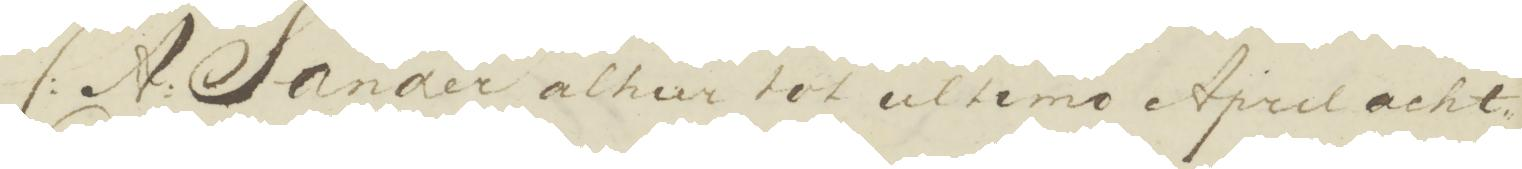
C: A: Sander alhier tot ultimo April acht„
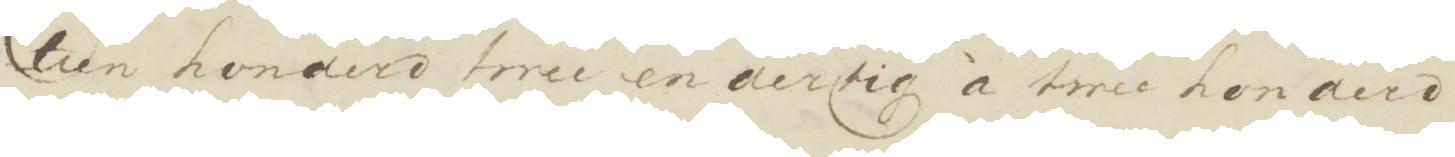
=tien honderd twee en dertig à twee honderd
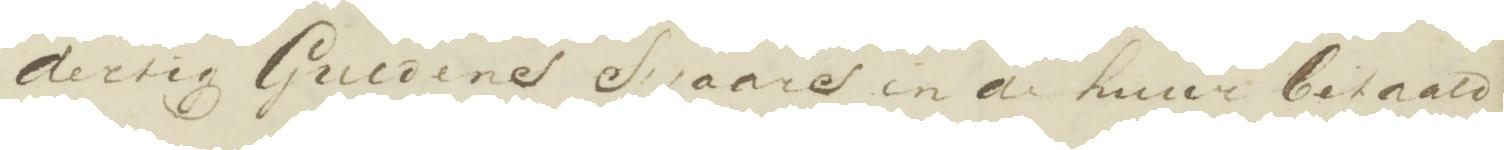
dertig Guldens s'jaars in de huur betaald
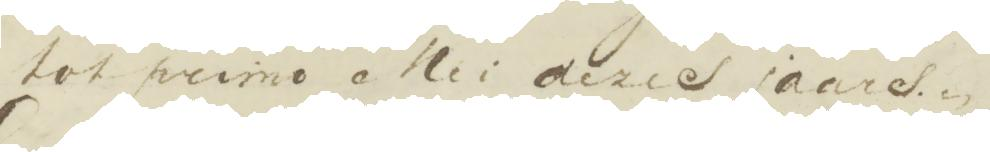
tot primo Mei dezes jaars.
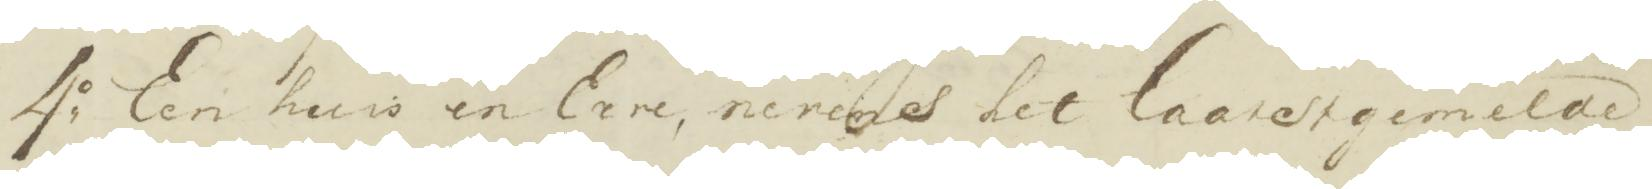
4„o Een huis en Erve, nevens het laatstgemelde
